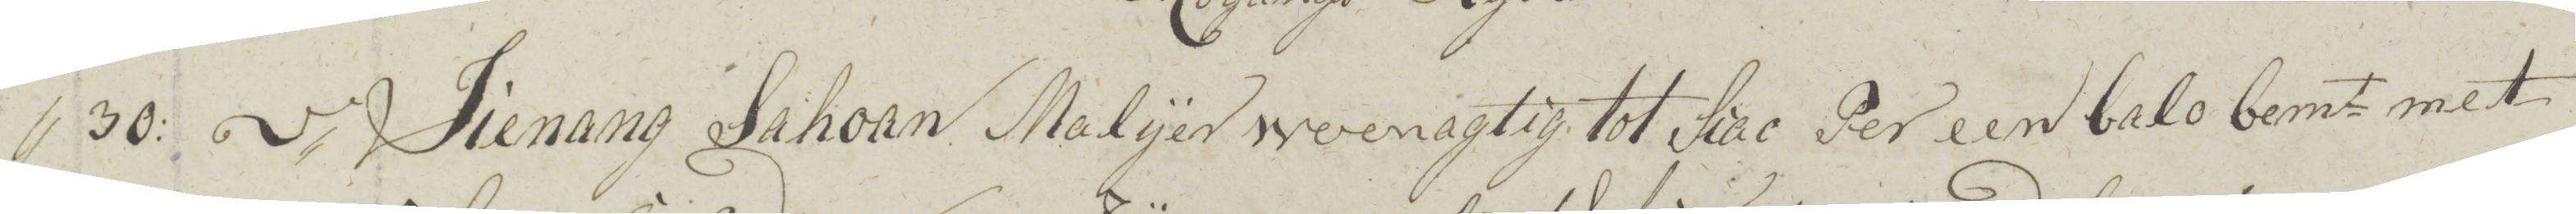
„ 30: D„' Tienang Sahoan Malijer woonagtig tot Siac Per een balo bem=t met
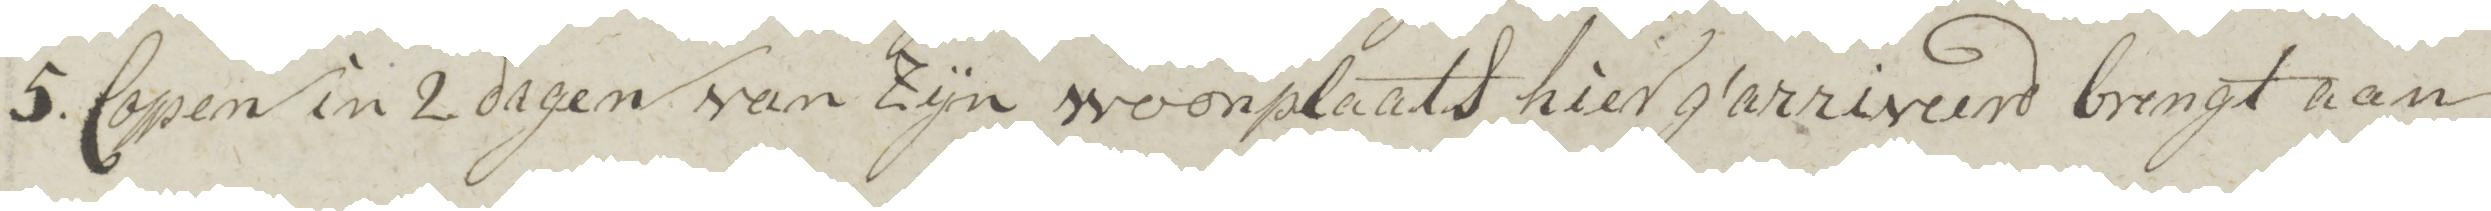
5. Coppen in 2 dagen van Zijn woonplaats hier g’arriveerd brengt aan
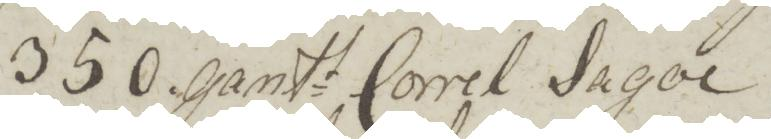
350. gant=s Correl Sagoe
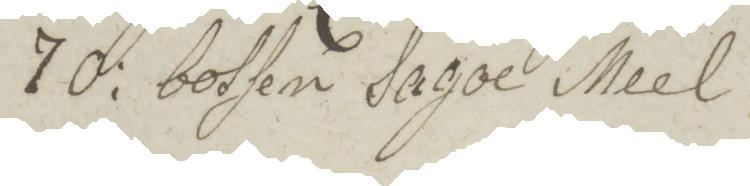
70: bossen Sagoe Meel
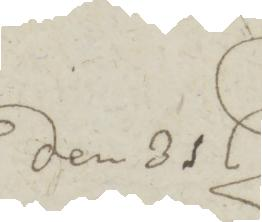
den 31'
